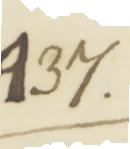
437.
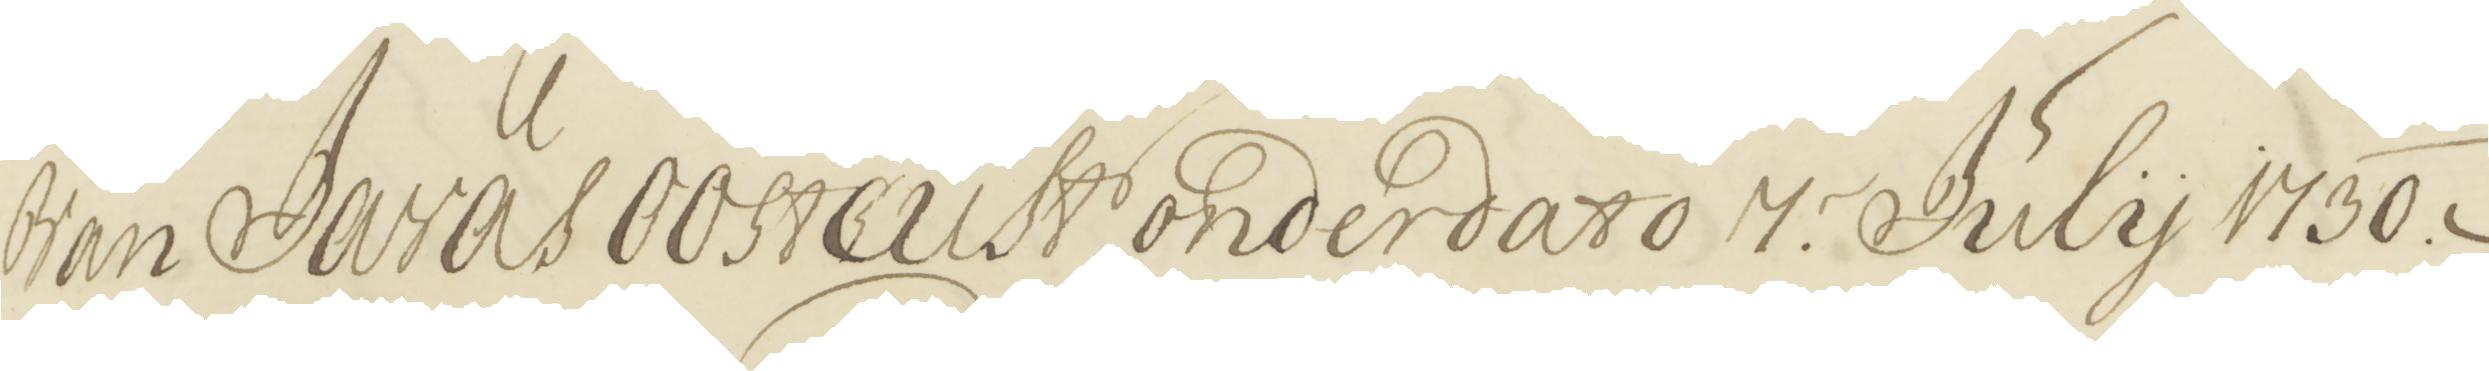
Van Javâs oostcust onder dato 7.' Julij 1730. —
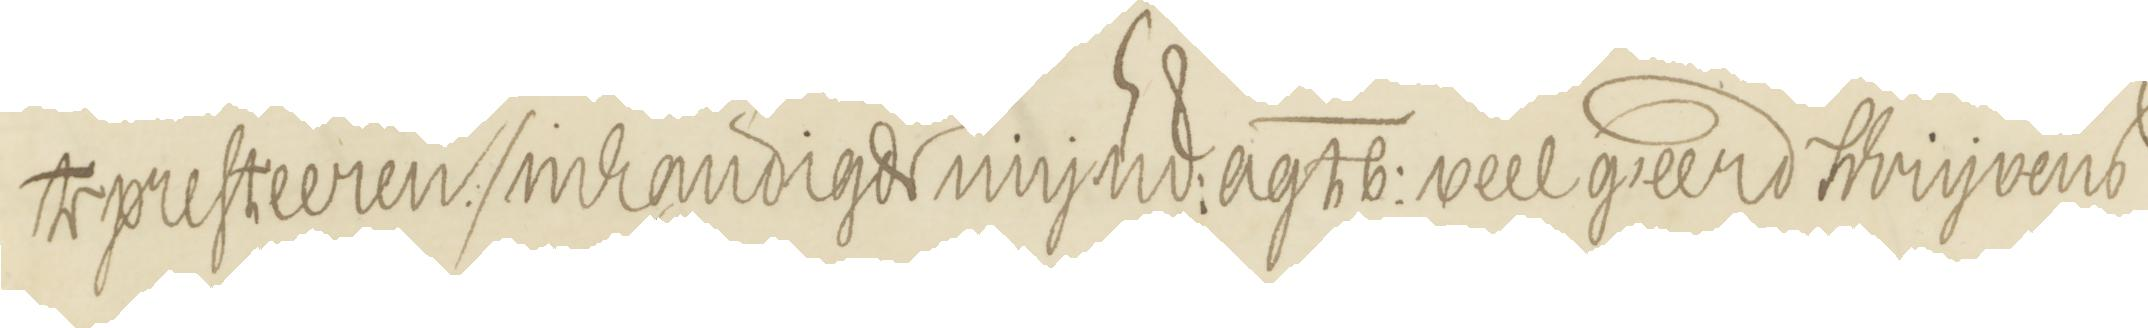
te presteeren:/ inhandigde mij uE: agtb: veel g'eerd schrijvens
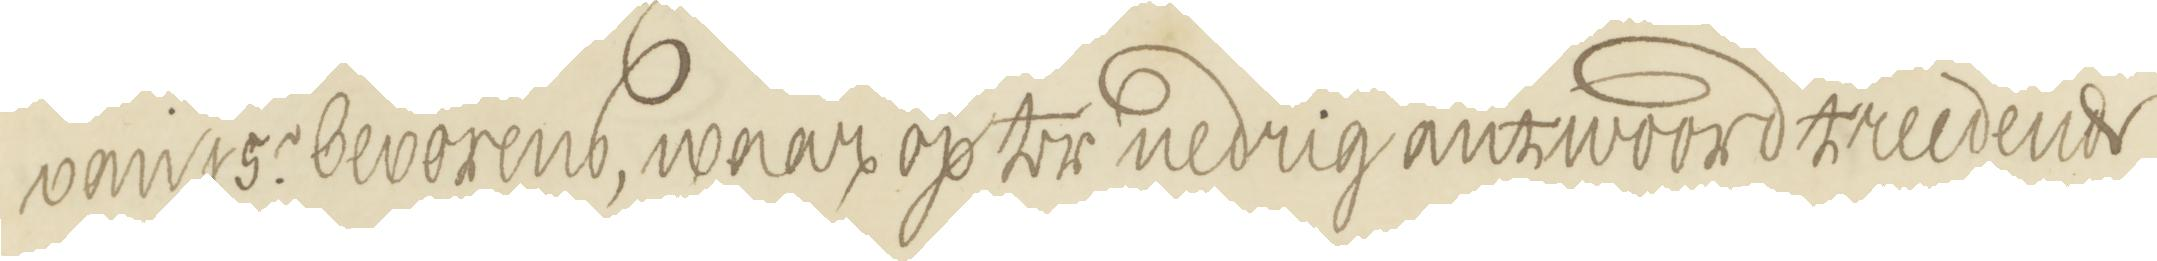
van 15.' bevorens, waar op ter nedrig antwoord treedende
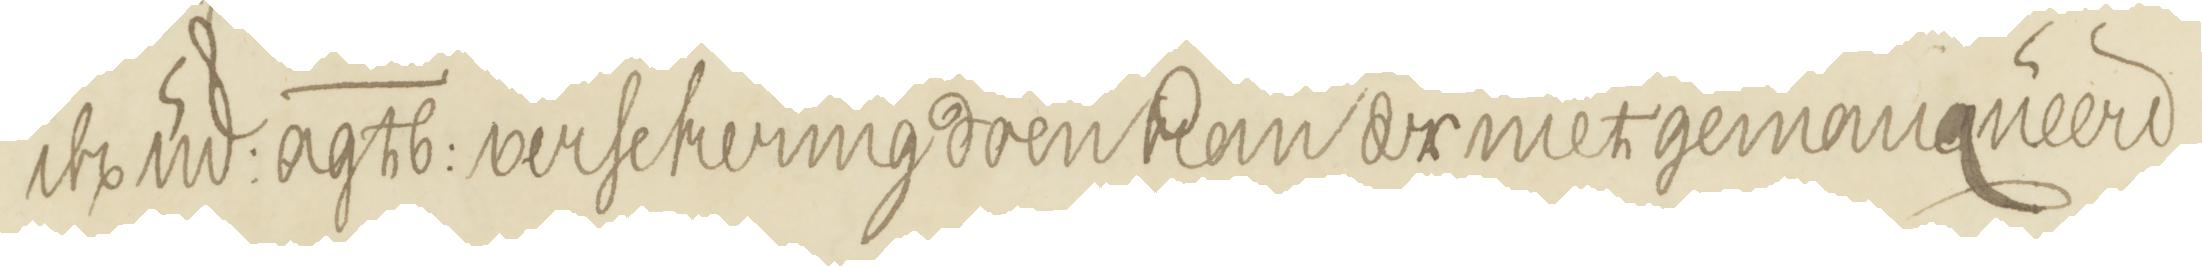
ik uE: agtb: versekering doen kan der niet gemanqueerd
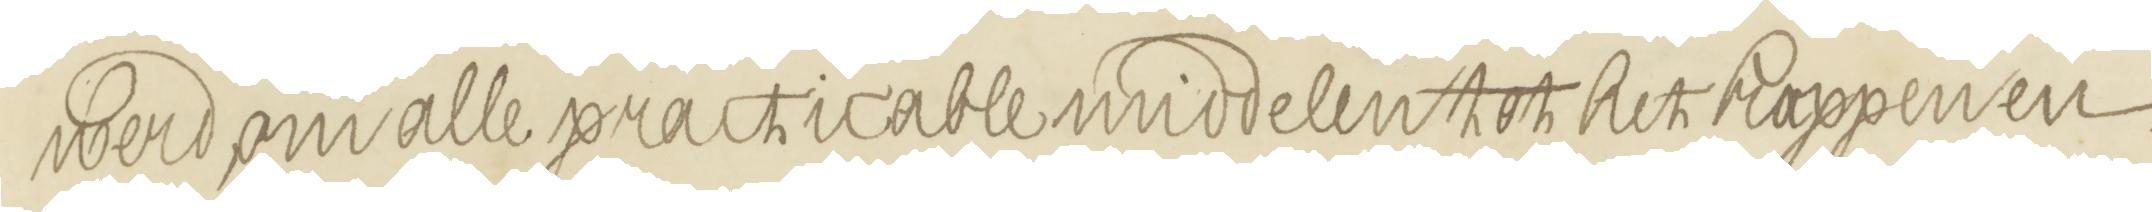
werd, om alle practicable middelen tot het kappen en
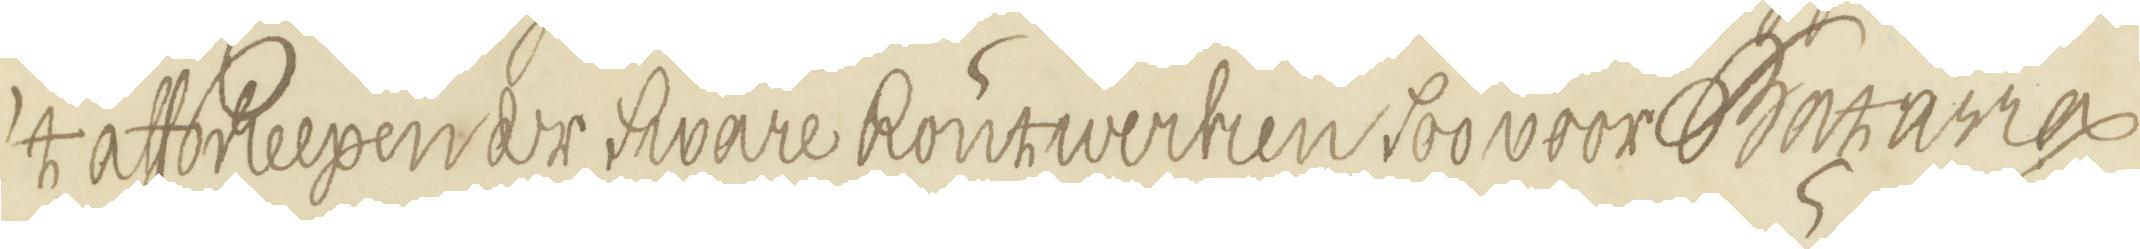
't affscheepen der sware houtwerken soo voor Batavia
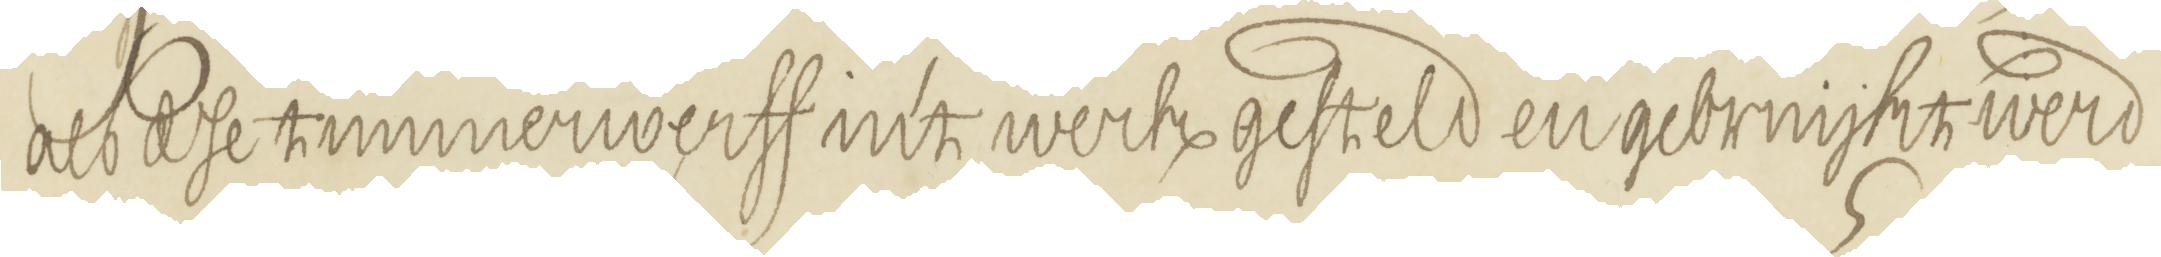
als dese timmerwerff in’t werk gesteld en gebruijkt werd
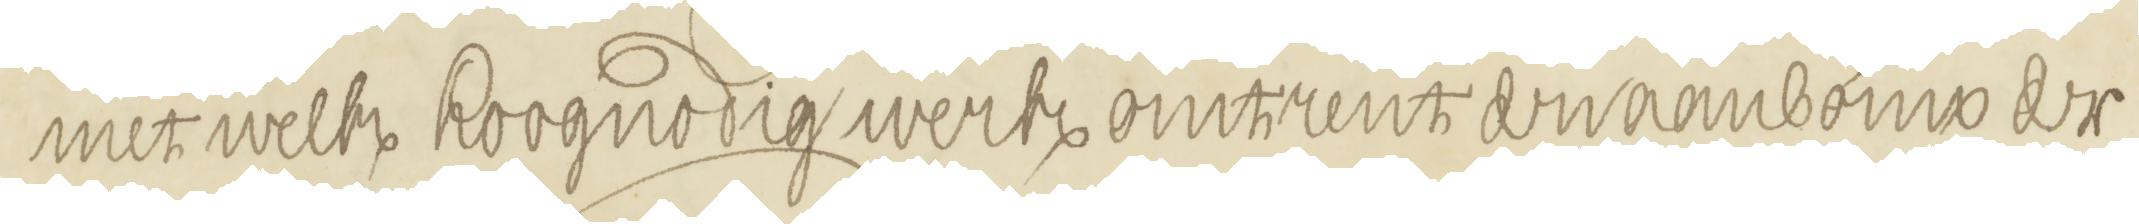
met welk hoognodig werk omtrent den aanbouw der
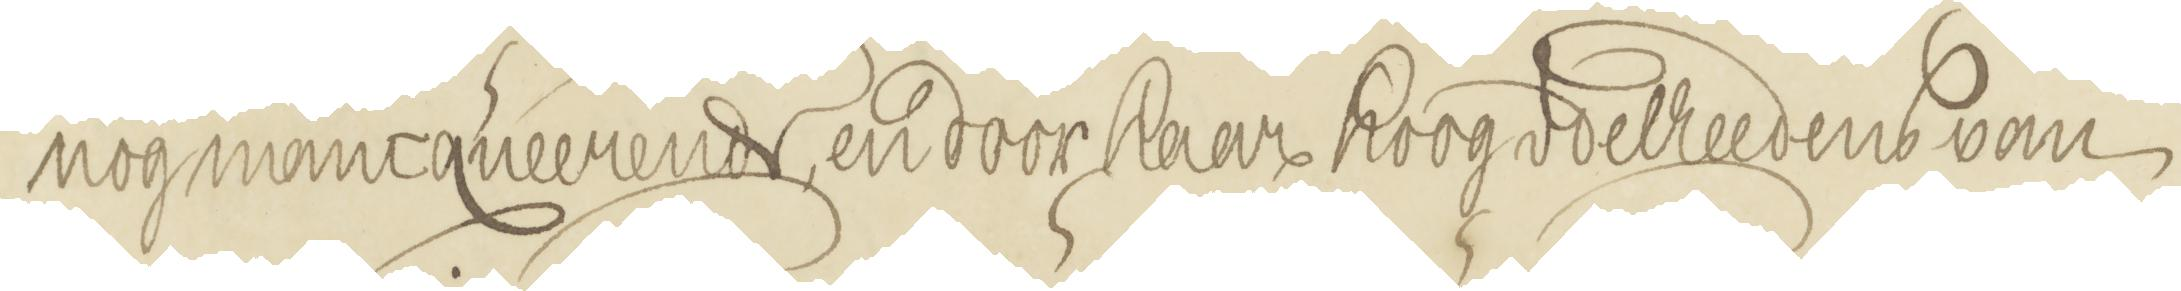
nog mancqueerende, en door haar hoog Edelheedens van
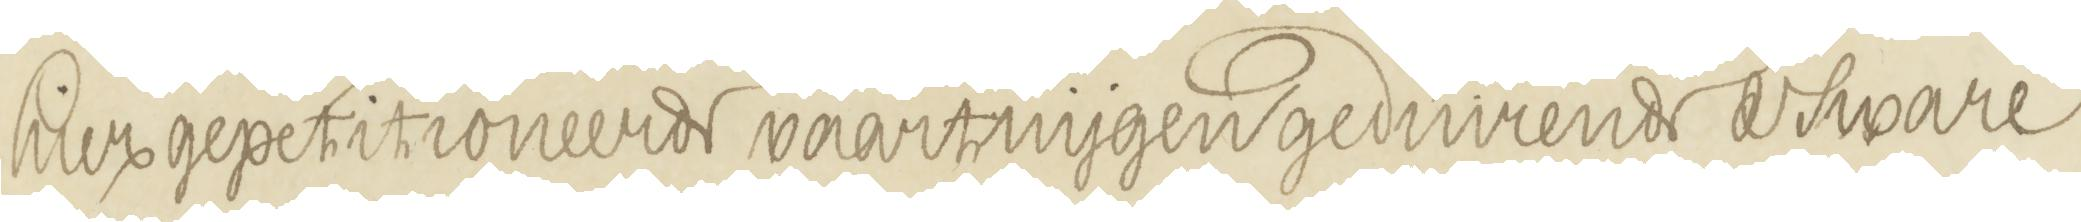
hier gepetitioneerde vaartuijgen geduirende de sware
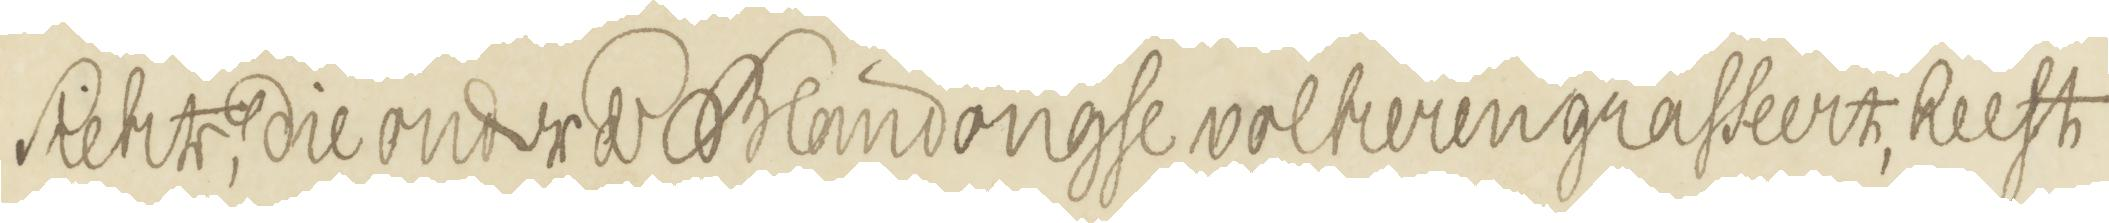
siekte, die onder de Blandongse volkeren grasseert, heeft
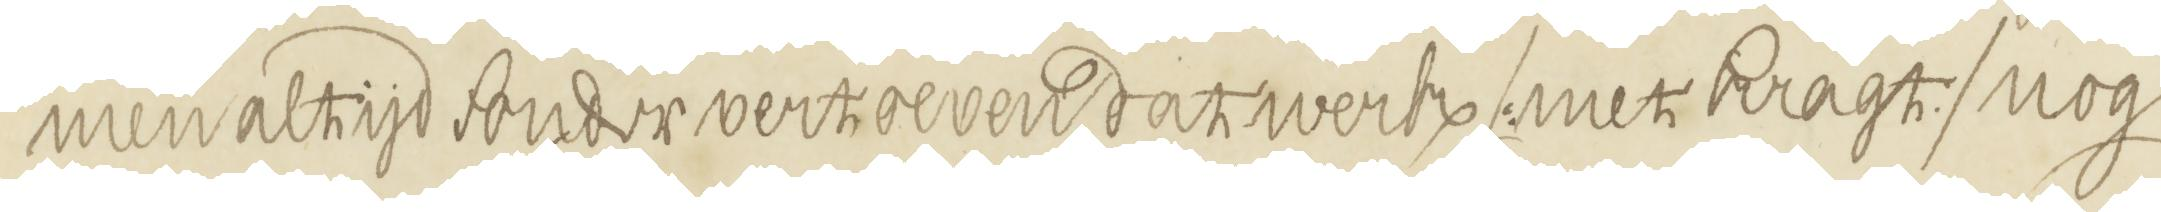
men altijd sonder vertoeven, dat werk /:met kragt:/ nog
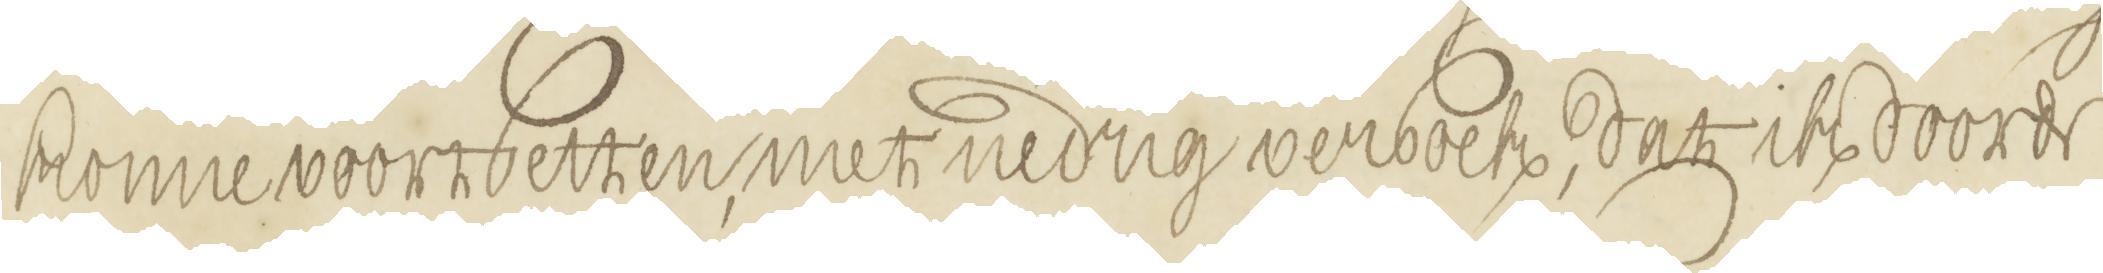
konne voortsetten, met nedrig versoek, dat ik door de
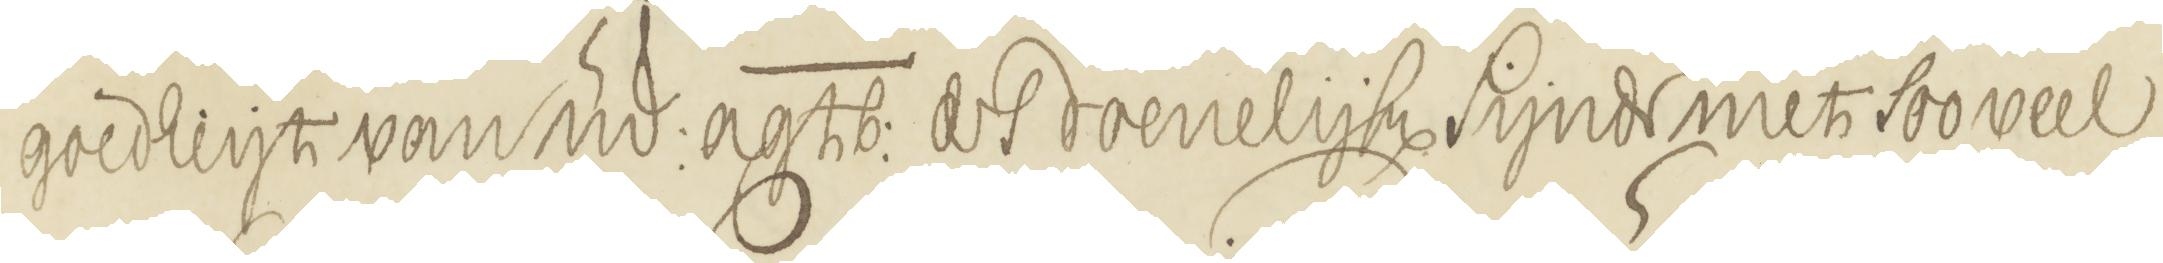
goedheijt van uE: agtb: des doenelijk sijnde met soo veel
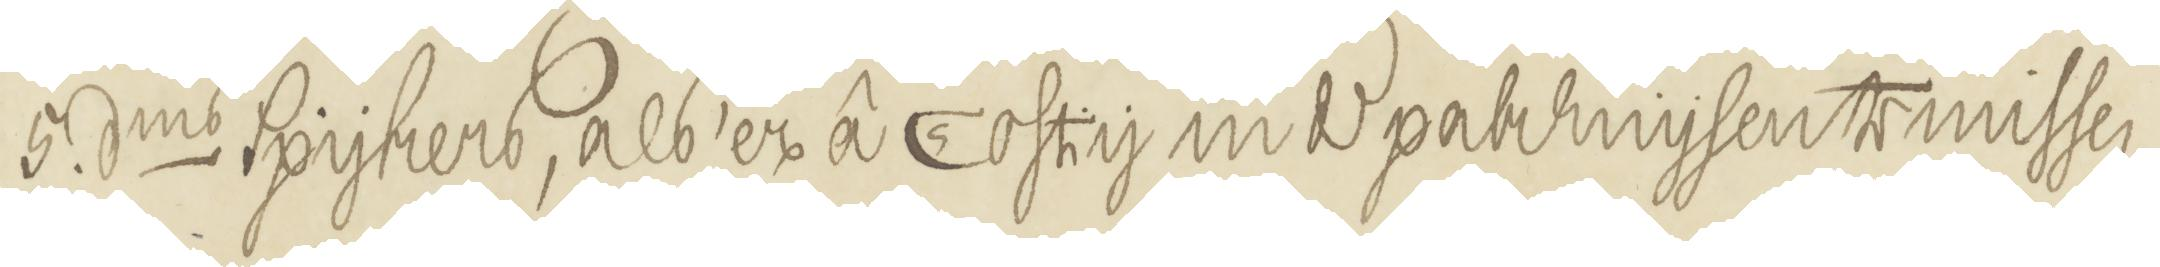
5. d_ms spijkers, als'er â costij in de pakhuijsen te missen
